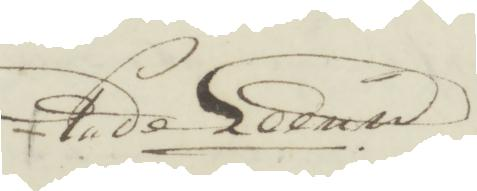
S: de Lodner
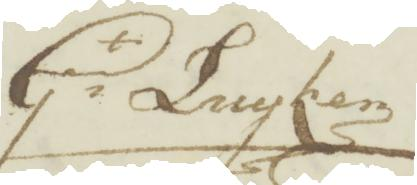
G=t Luyken
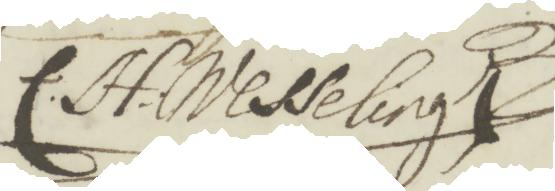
C. H. Wesseling
